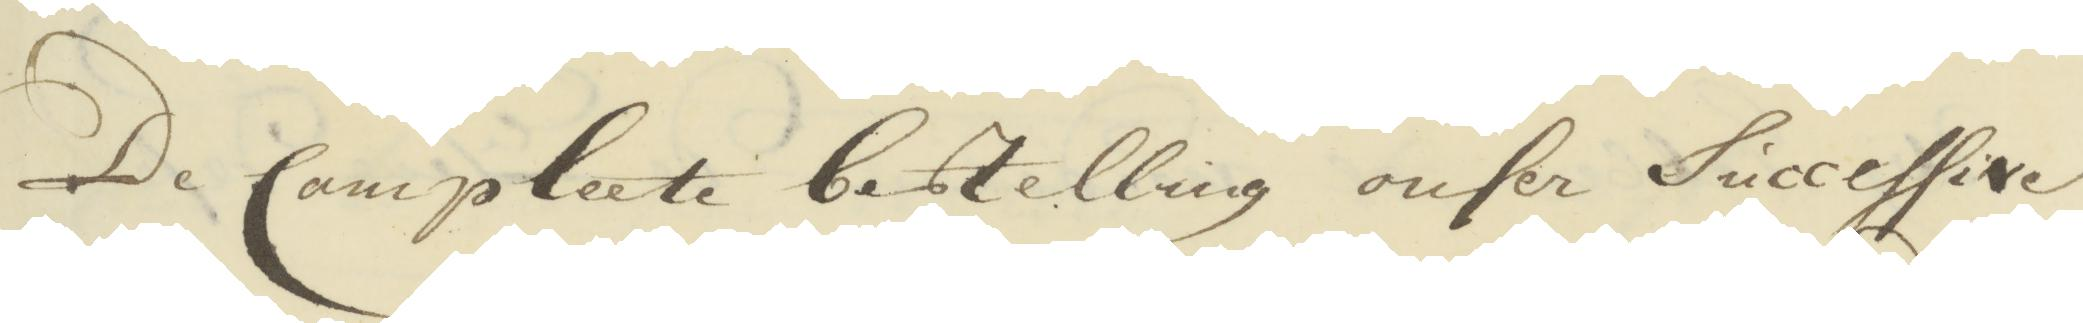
De Compleete bestelling onser successive
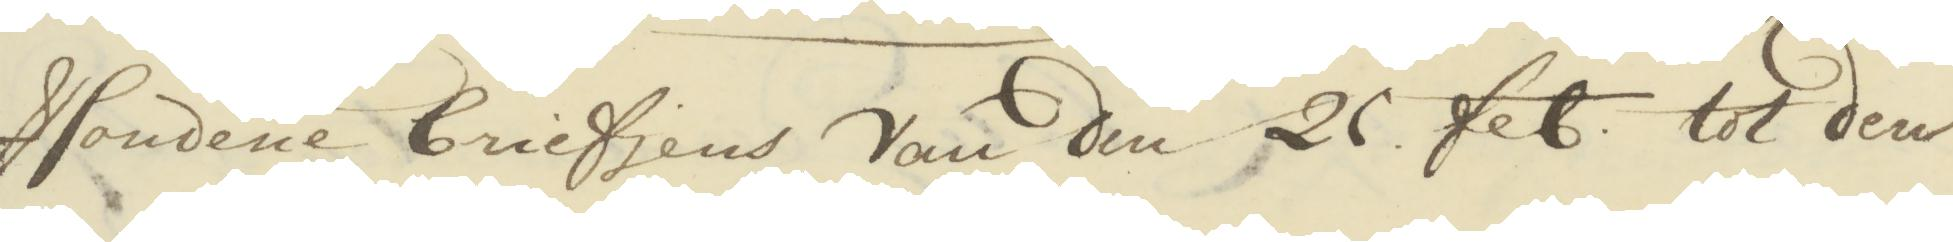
versondene briefjens van den 25. feb. tot den
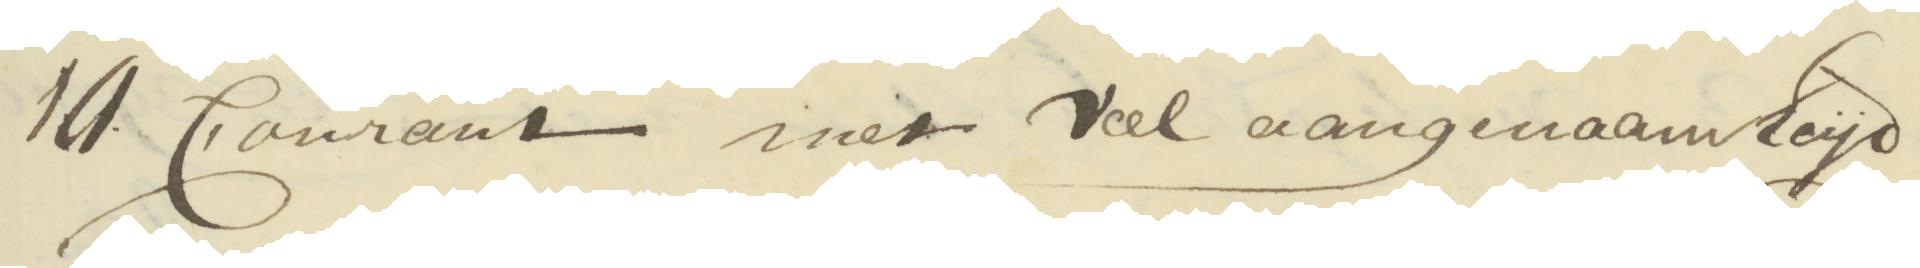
14. Courant niet veel aangenaamheijd
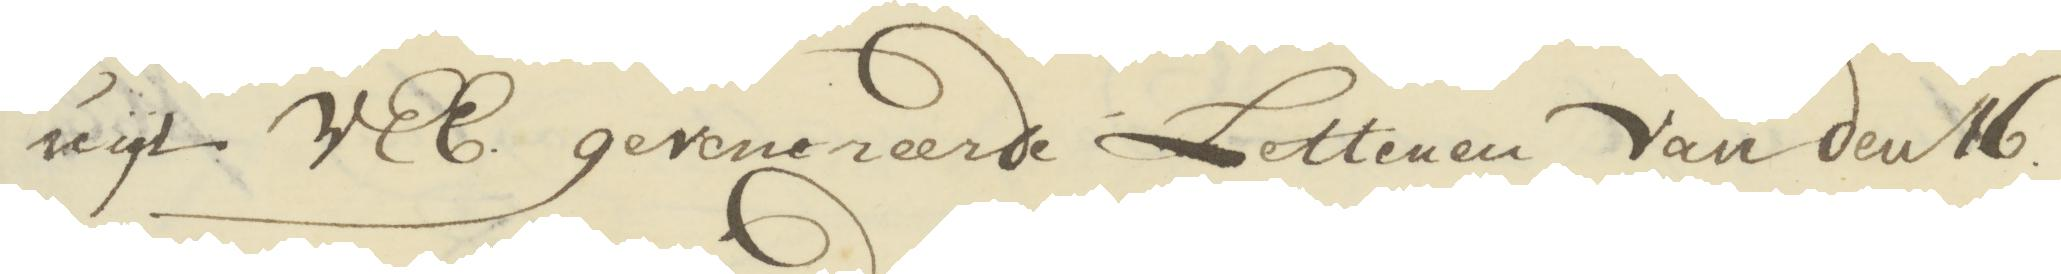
uijt VEE. gevenereerde Letteren van den 16.
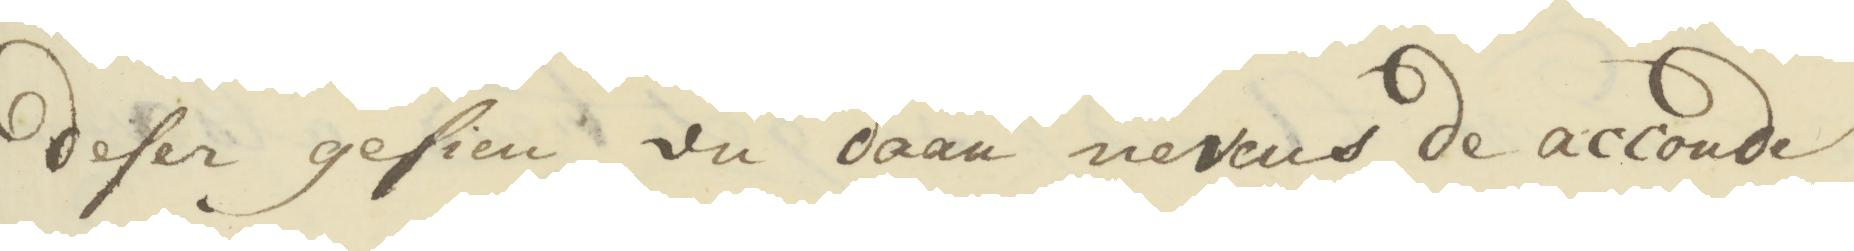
deser gesien en daar nevens de accorde
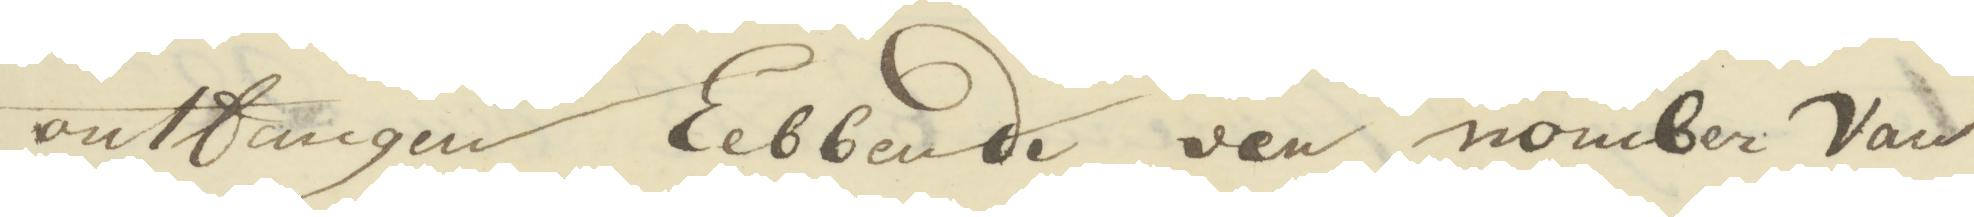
ontfangen hebbende een nomber van
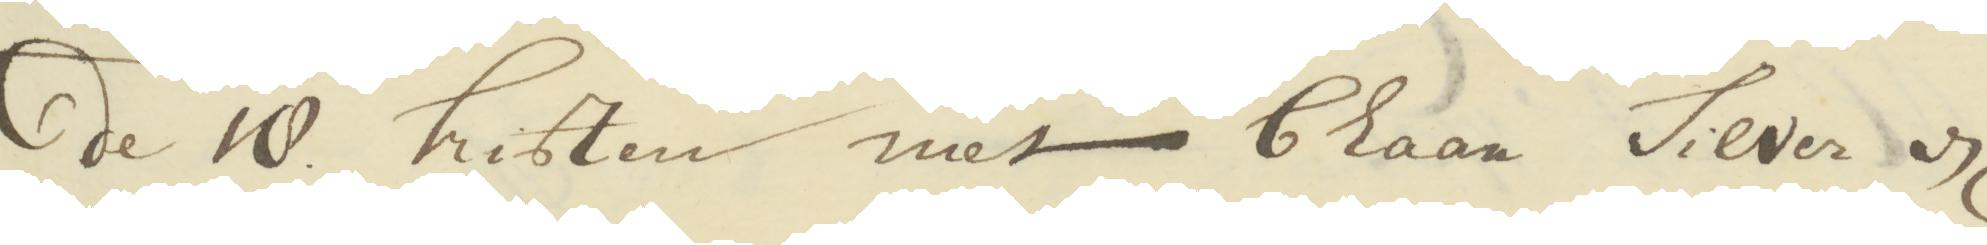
de 18. kisten met bhaar silver en
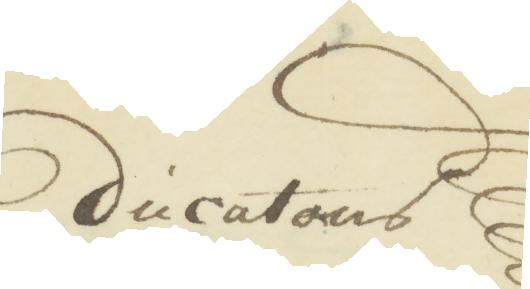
ducatons
